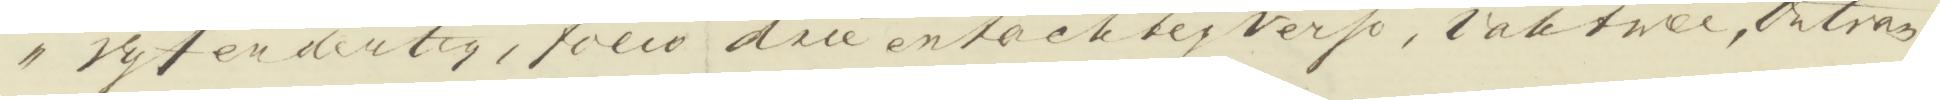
„ vyf en dertig, folio drie en tachtig verso, vak twee, ontvan,
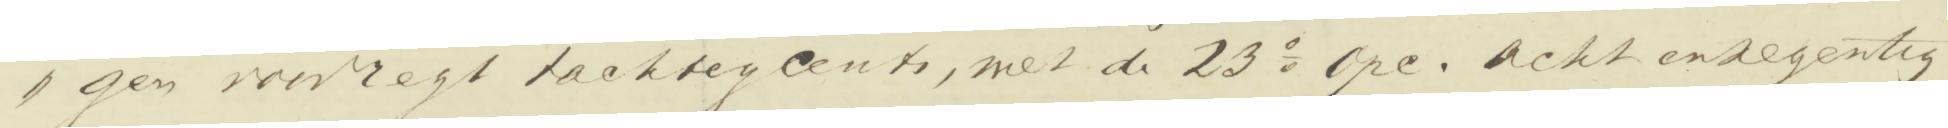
„ gen voorregt tachteg cents, met de 23% opc. acht en negentig
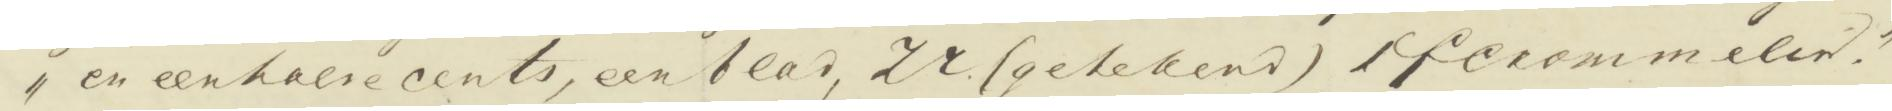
„ en een halve cents, een blad, ZR. (getekend) DF crommelin. ''
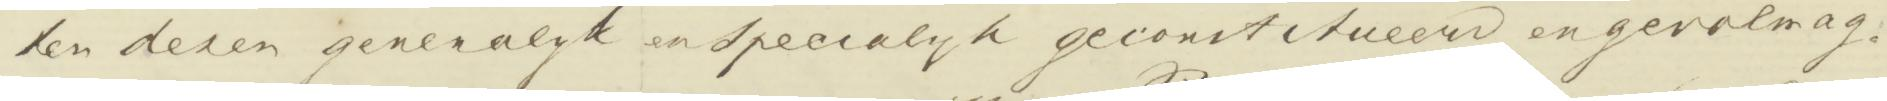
ten dezen generalyk en specialyk geconstitueerd en gevolmag„
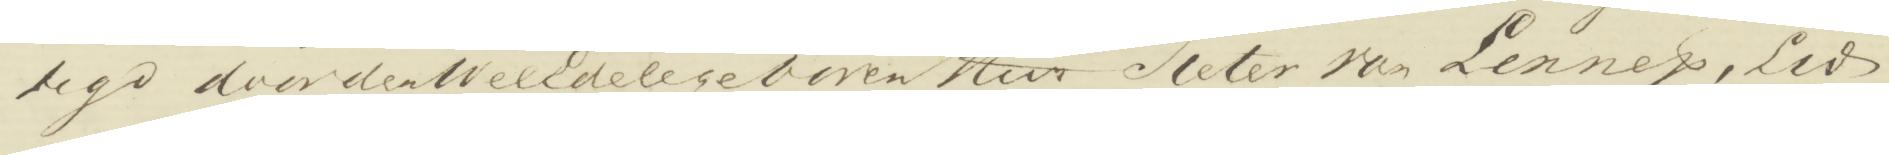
tigd door den WelEdelegeboren Heer Pieter van Lennep, Lid
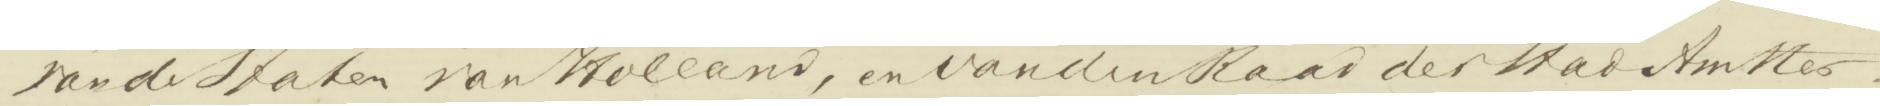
van de staten van Holland, en van den Raad der stad Amster_
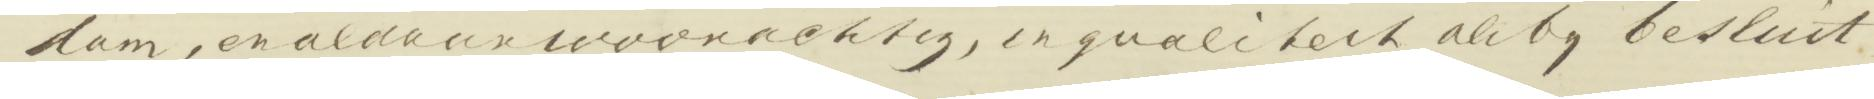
dam, en aldaar woonachtig, in qualiteit als by besluit
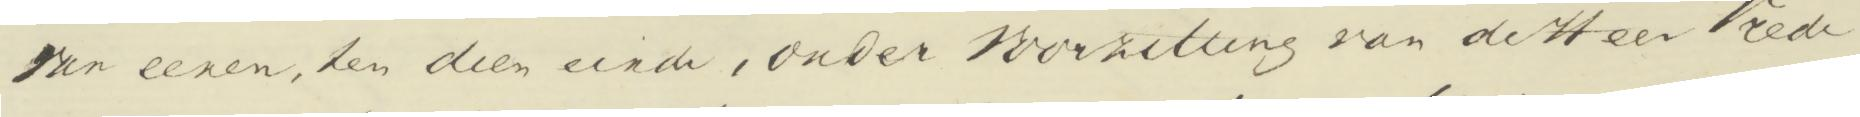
van eenen, ten dien einde, onder Voorzitting van de Heer Vrede
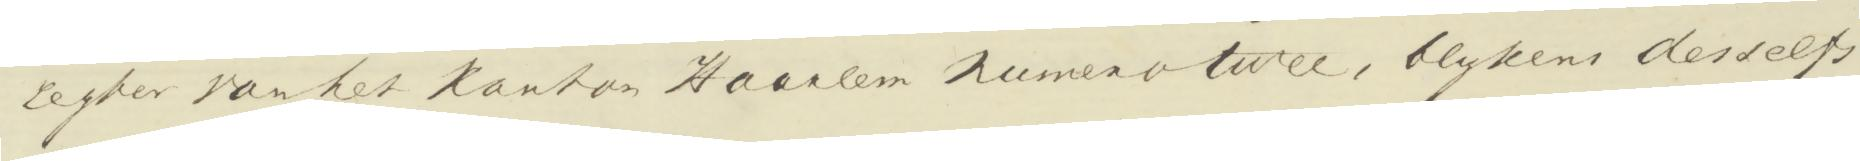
regter van het kanton Haarlem numero twee, blykens desselfs
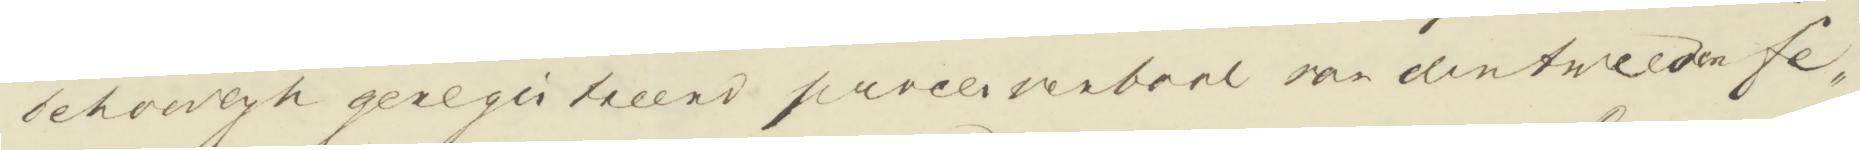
behoorlyk geregistreerd proces verbaal van den tweeden fe„
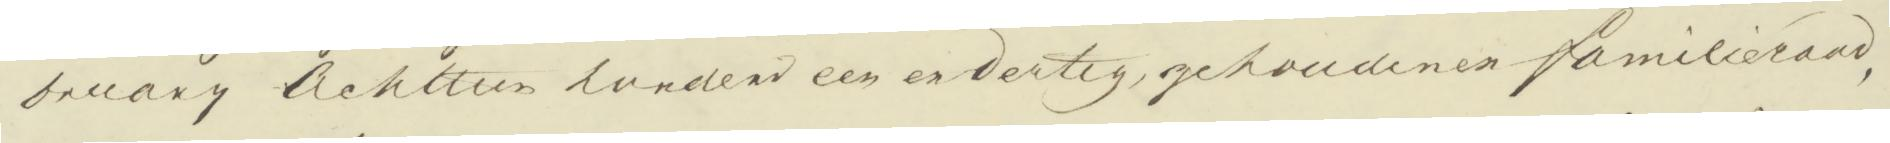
bruary Achttien honderd een en dertig, gehoudenen familieraad,
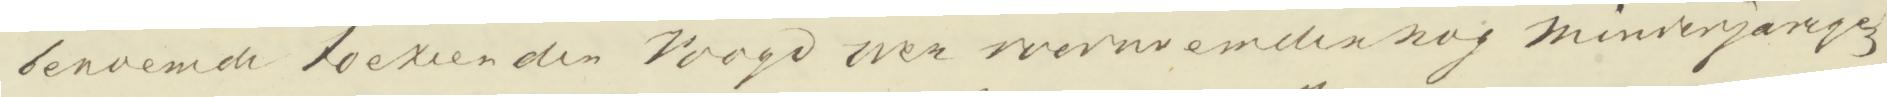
benoemde toezienden Voogd over voornoemden nog minderjarigen
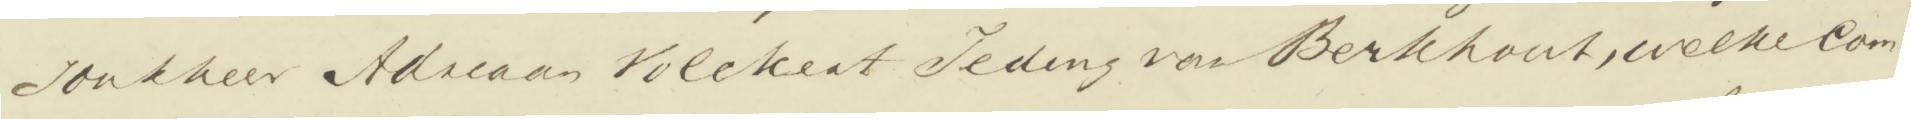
Ionkheer Adriaan Volckert Teding van Berkhout, welke Com
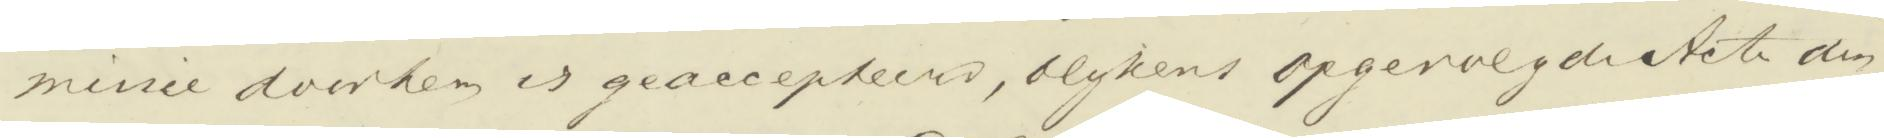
missie door hem is geaccepteerd, blykens opgevolgde Acte den
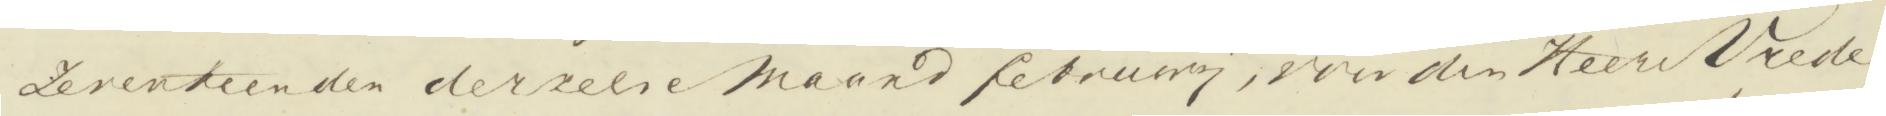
Zeventienden derzelve Maand februarij, voor den Heer Vrede
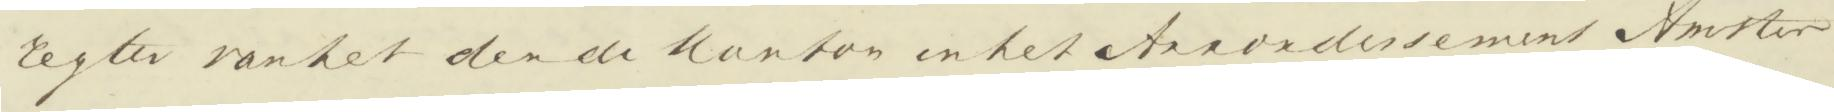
regter van het der de kanton in het Arrondissement Amster
